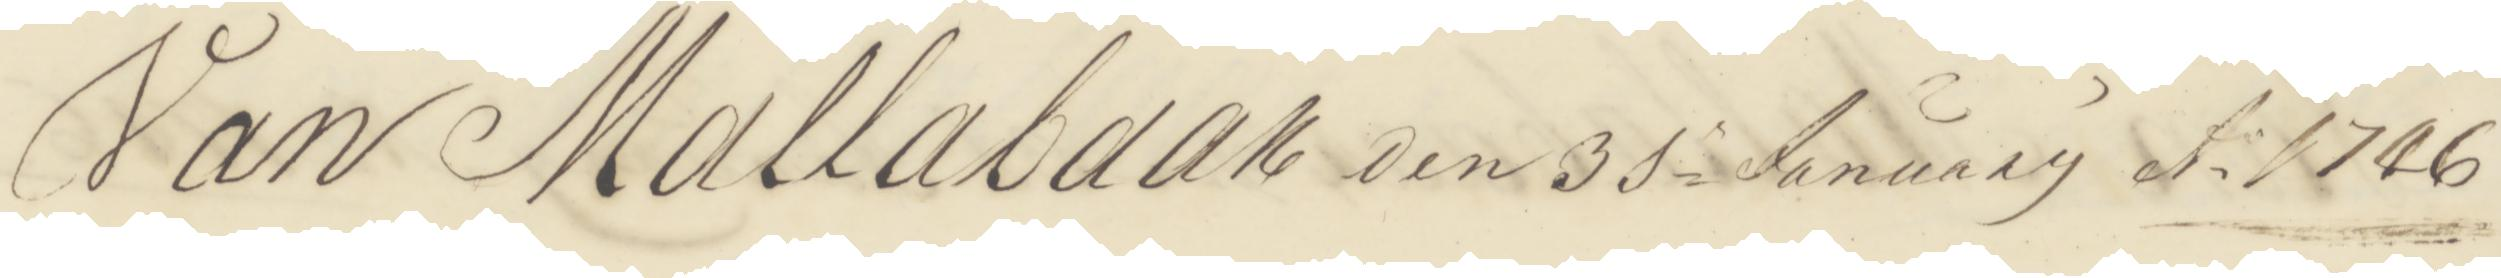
Van Mallabaar den 31=e Ianuarij A:o 1746.
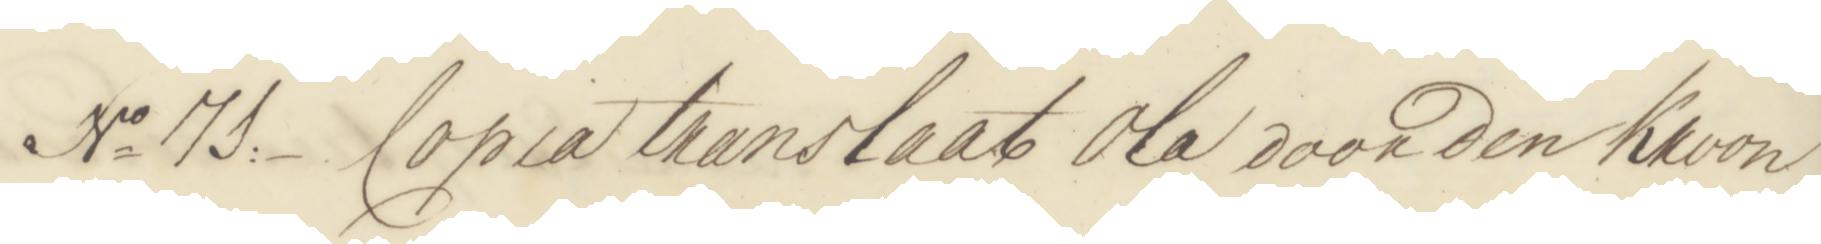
N=o 71: -. Copia translaat ola door den kroon
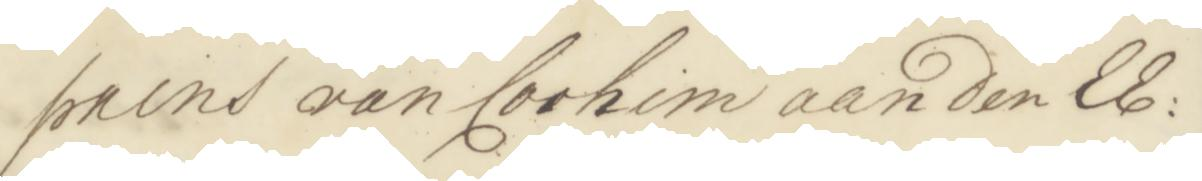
prins van Cochim aan den EE:
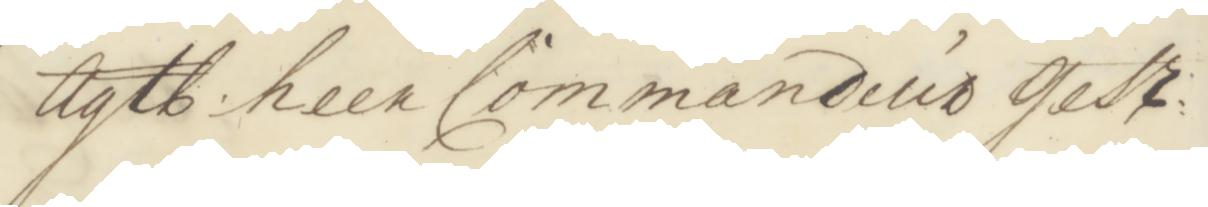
Agtb: heer Commandeur gesz:
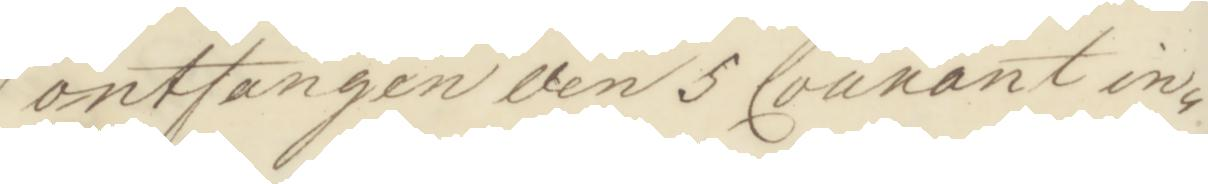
ontfangen den 5 Courant in„
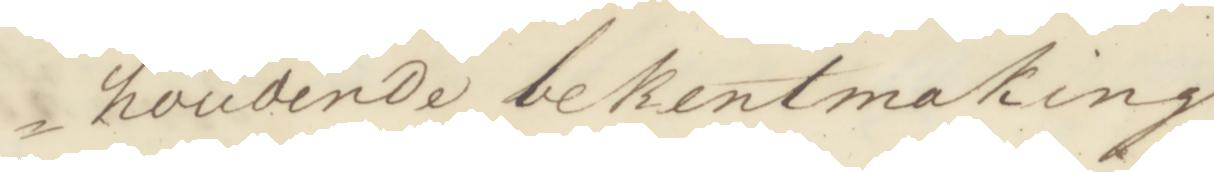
=houdende bekentmaking
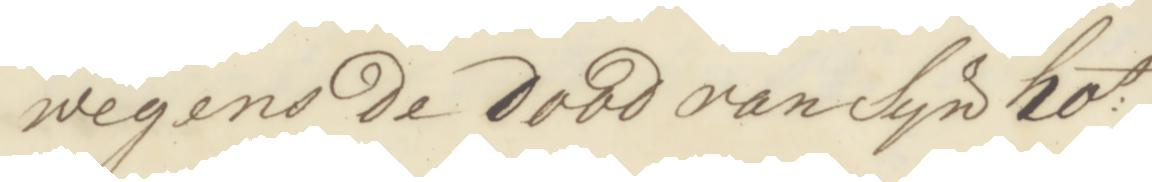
wegens de dood van sijn ho:t
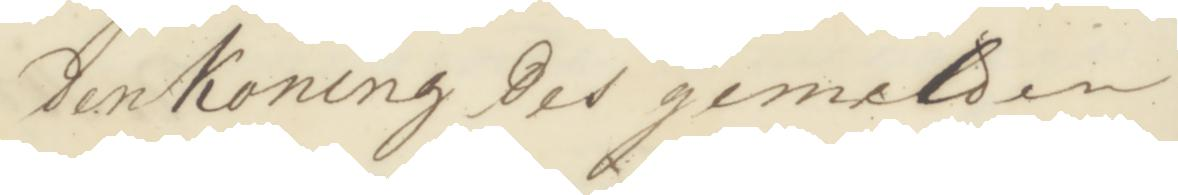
den koning des gemelden
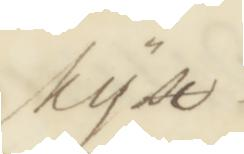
rijx
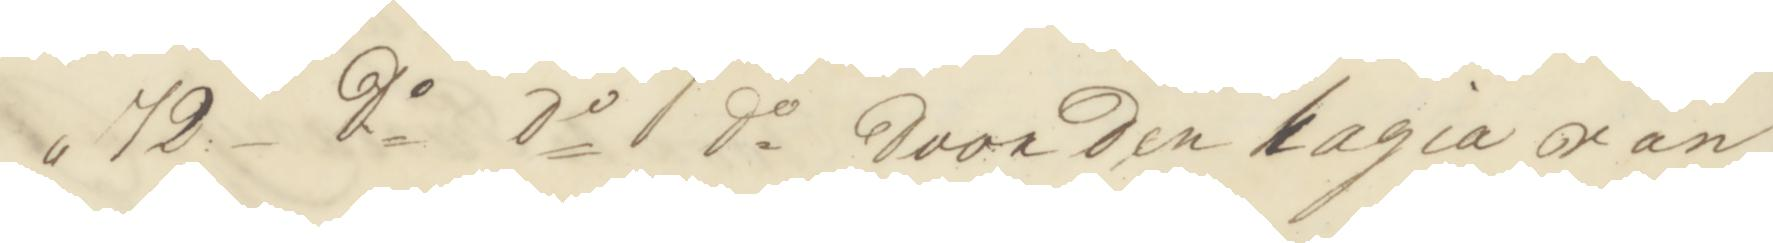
„ 72.- d=o d=o d=o door den kagia van
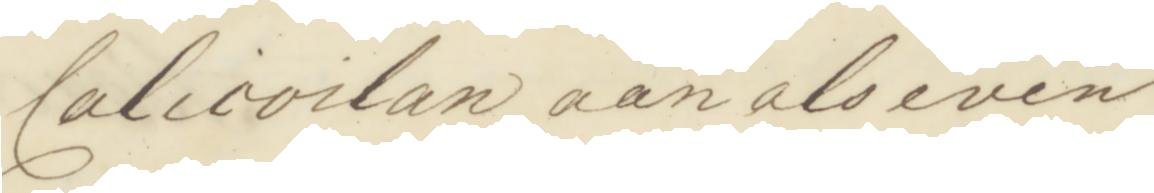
Calicoilan aan als even
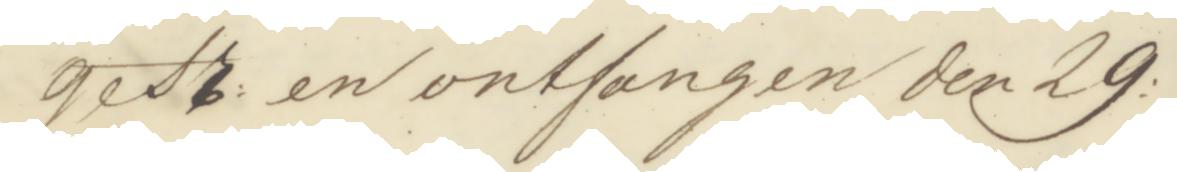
gesz: en ontfangen den 29:
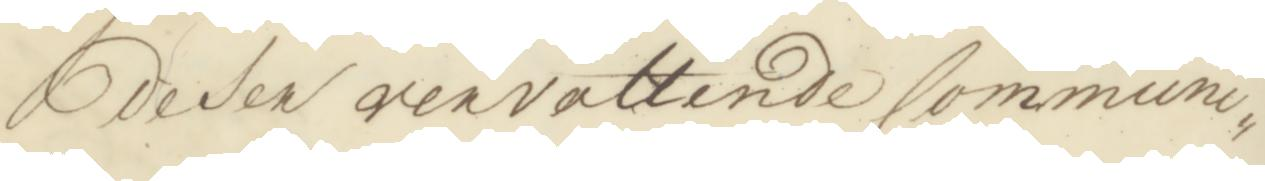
deser vervattende Communi„
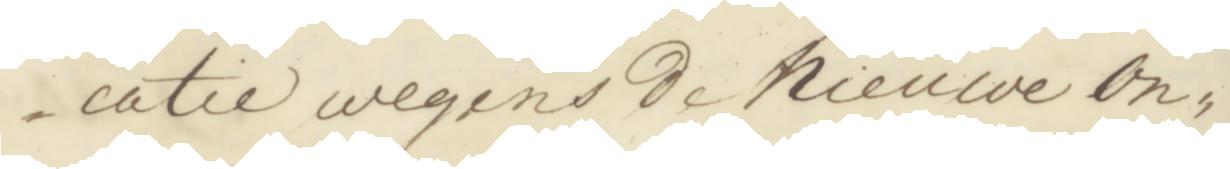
„catie wegens de nieuwe on„
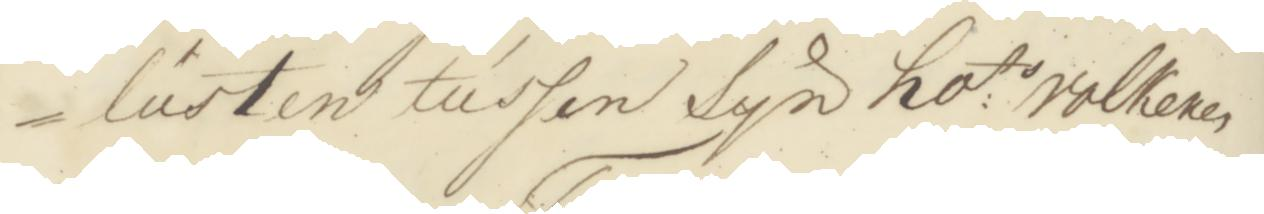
=lusten tussen sijn ho:ts volkeren
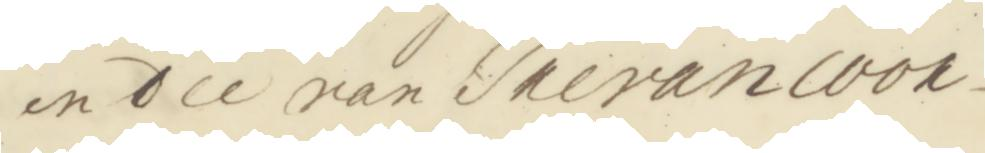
en die van Trevancoor
